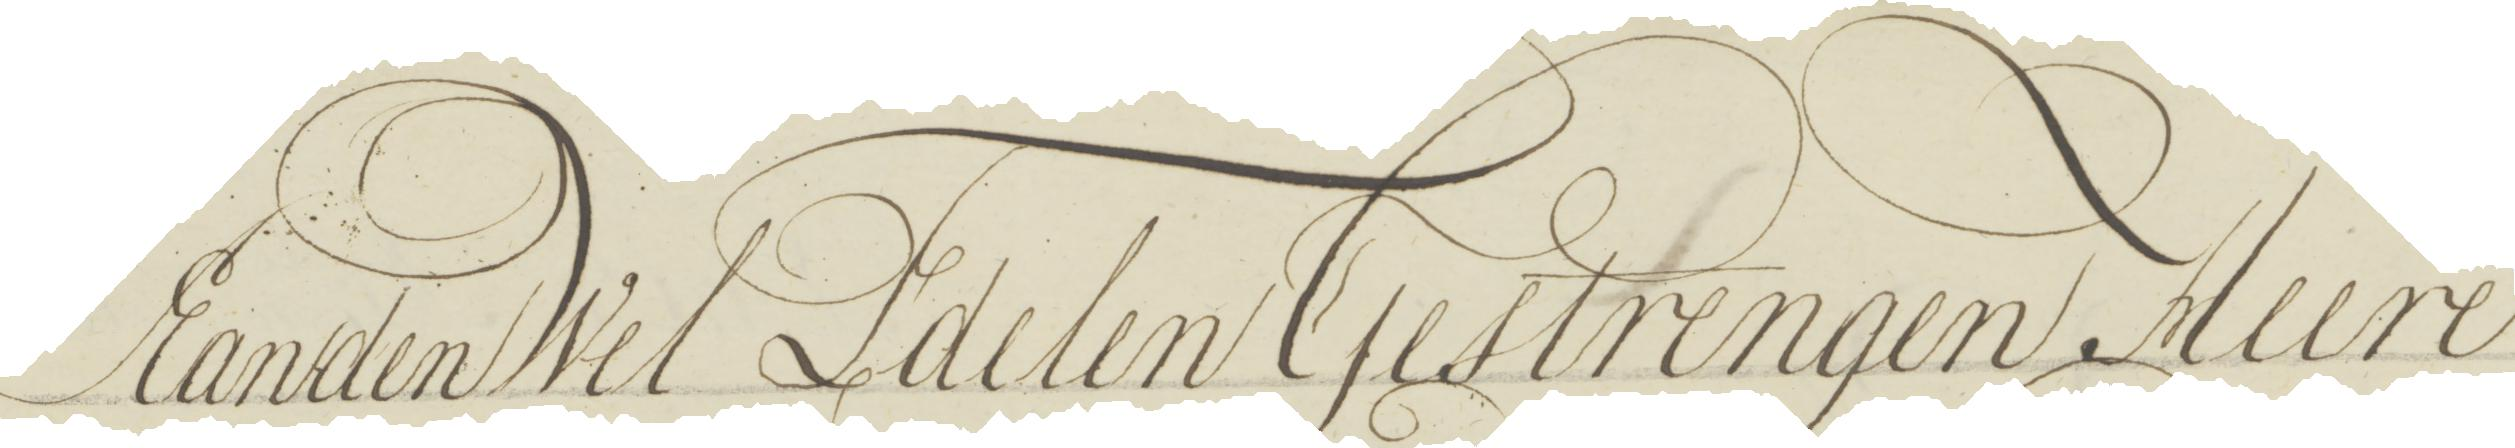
Aanden Wel Edelen Gestrengen Heere
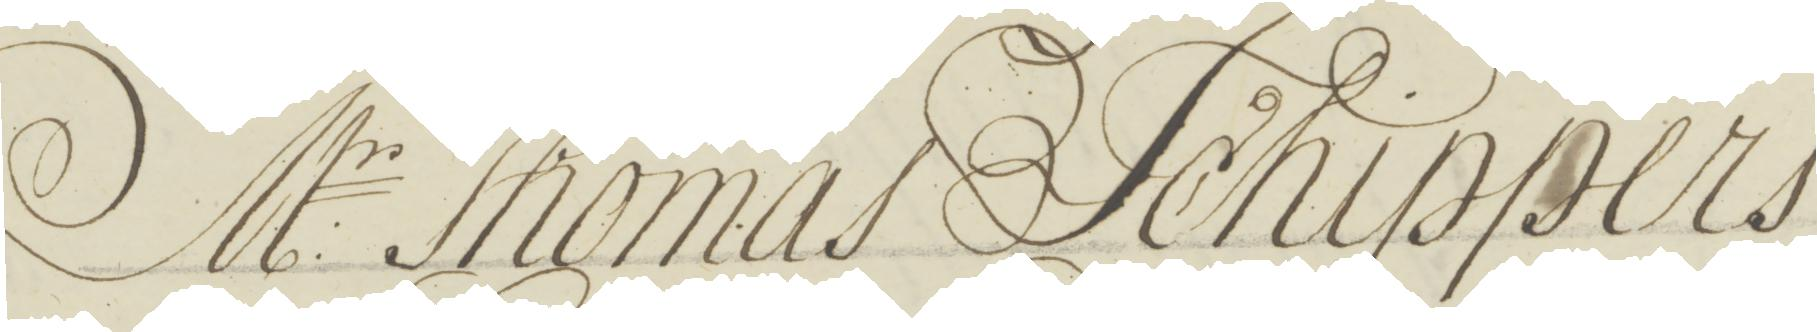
M=r Thomas Schippers
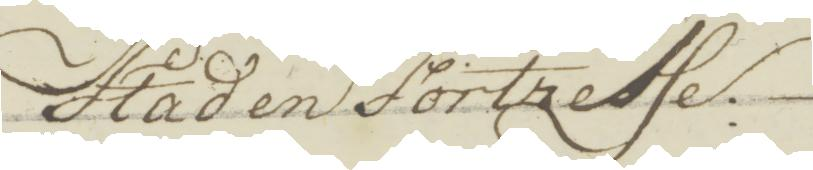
Staden Fortresse:—
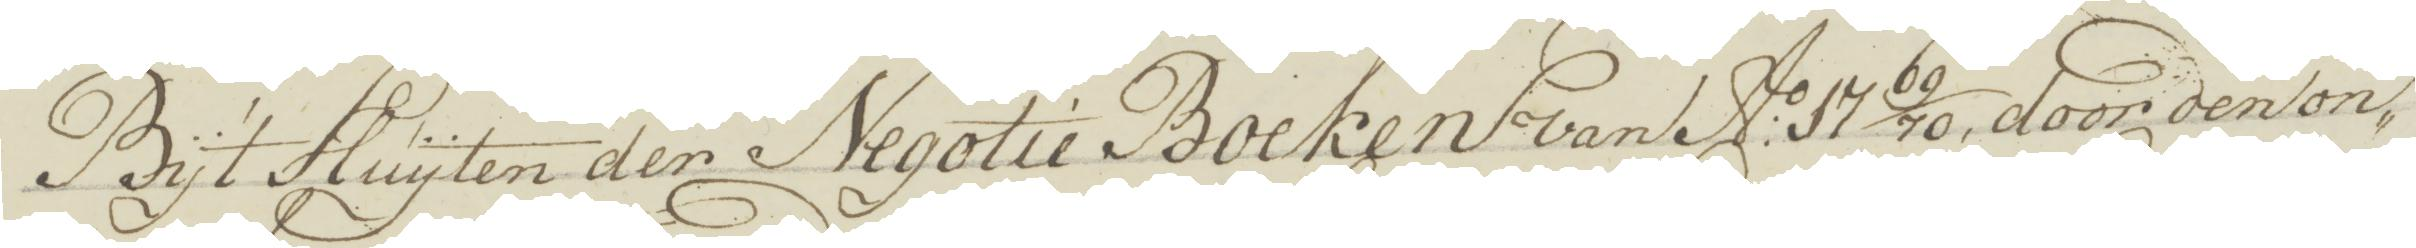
Bij 't sluijten der Negotie Boeken van A:o 1760/70, door den on„
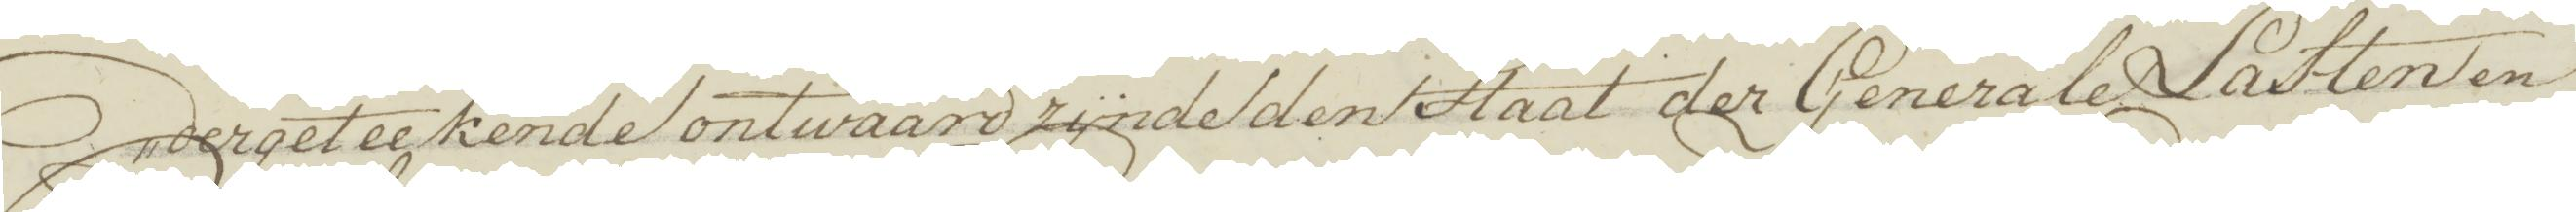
dergeteekende ontwaard zijnde den staat der Generale Lasten en
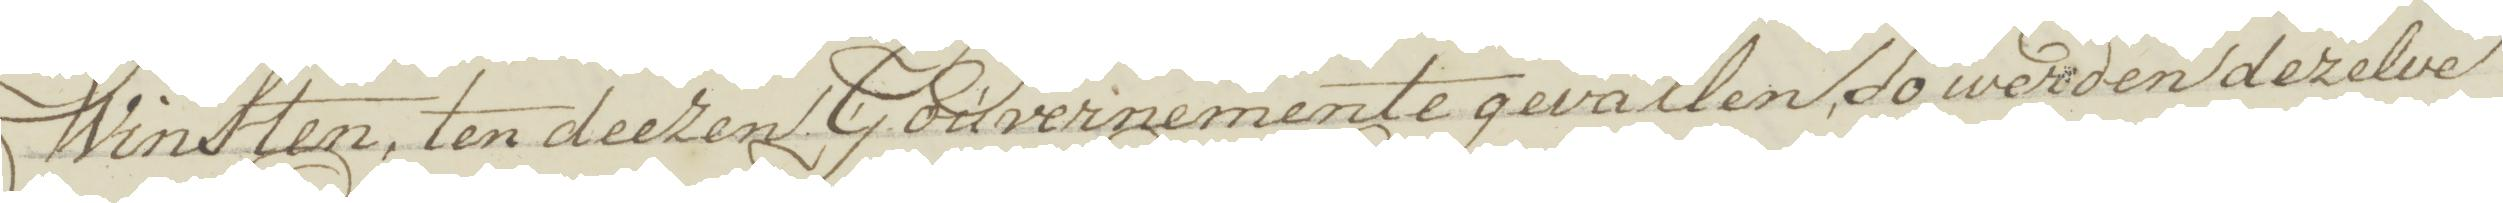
Winsten, ten deezen Gouvernemente gevallen, so werden dezelve
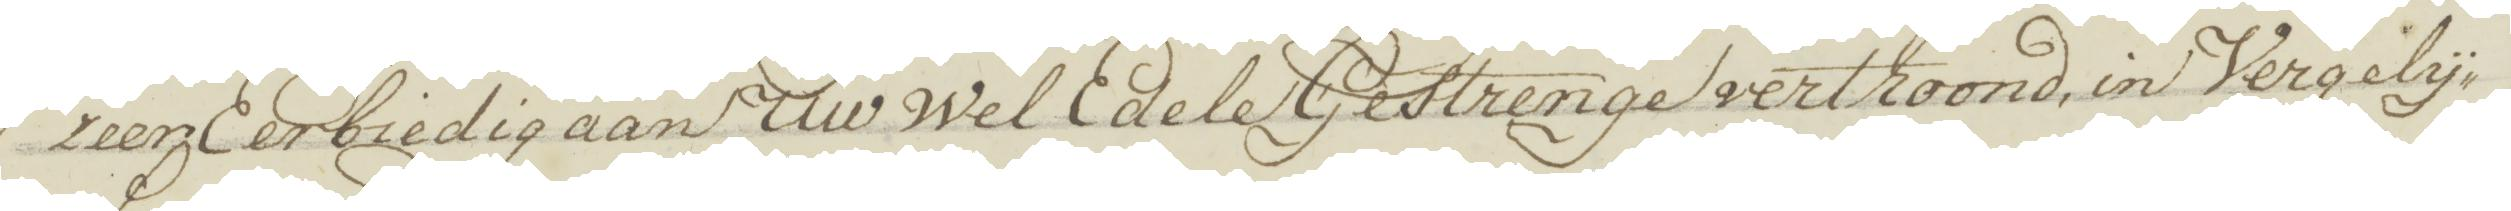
zeer Eerbiedig aan uw wel Edele Gestrenge verthoond, in Vergelij„
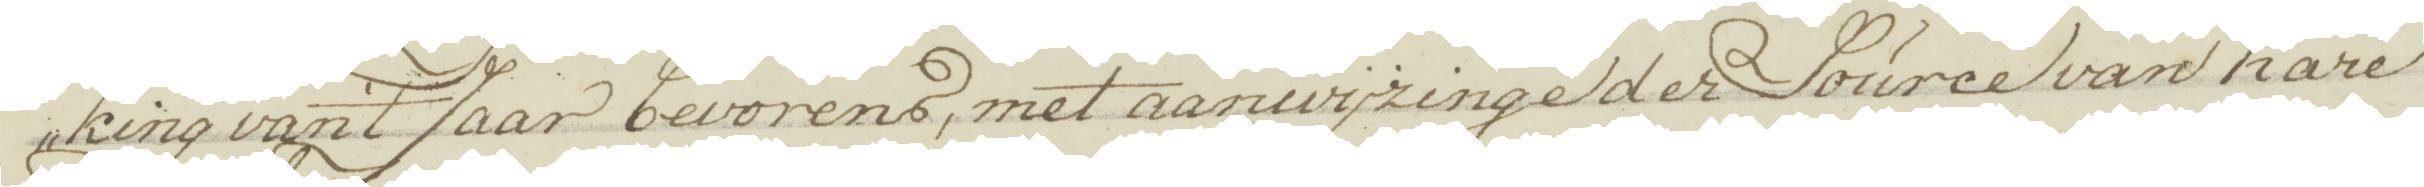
„king van 't Jaar bevorens, met aanwijzinge der Source van hare
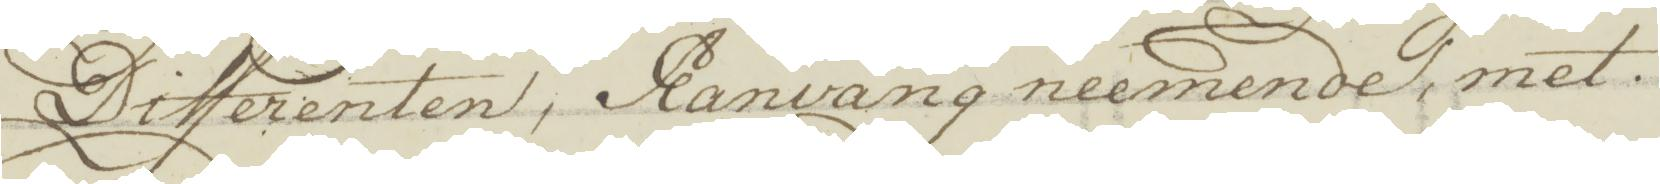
Differenten, Aanvang neemende, met.
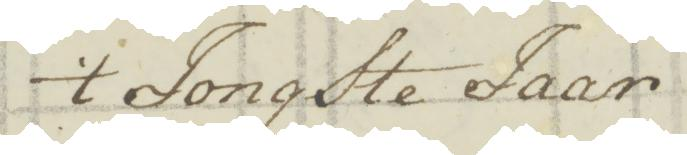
’t Iongste Iaar
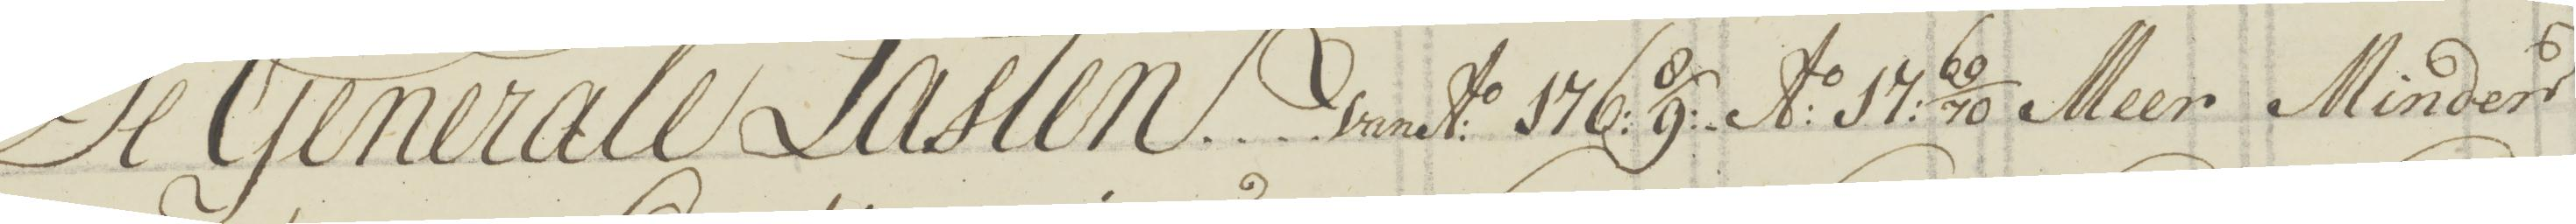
De Generale Lasten . . . . van A:o 176:8/9: A:o 17:60/70 Meer Minder
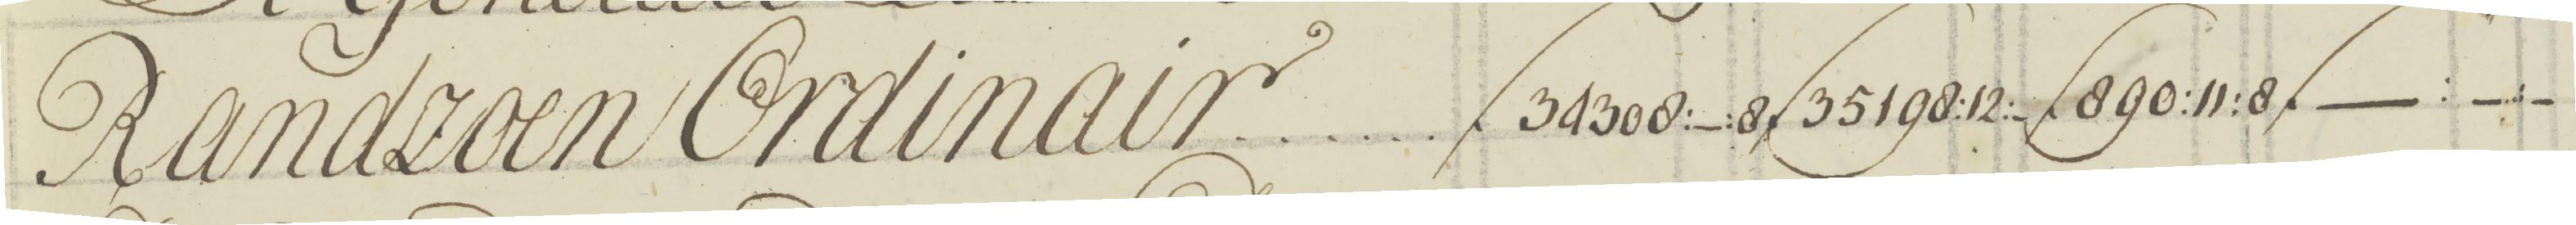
Randzoen Ordinair . . . . . . ƒ34308:—:8 ƒ35198:12:- ƒ890:11:8ƒ—:—:—
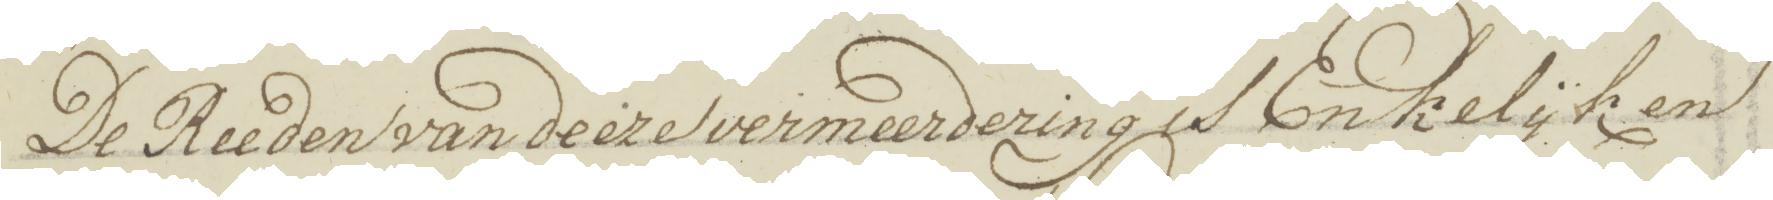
De Reeden van deeze vermeerdering is Enkelijk en
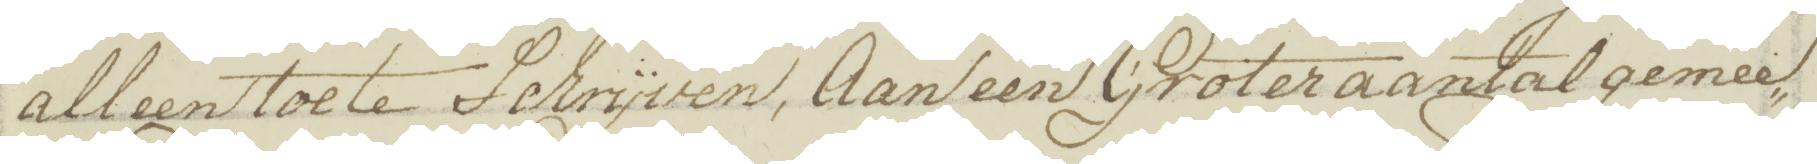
alleen toe te schrijven, Aan een Groter aantal gemee„
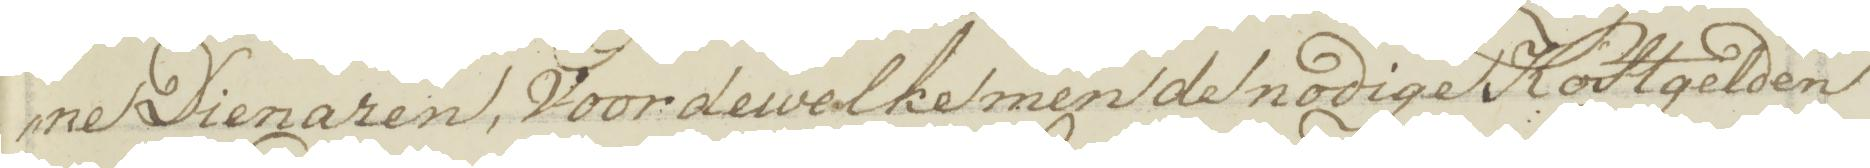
ne Dienaren, Voor dewelke men de nodige Kostgelden
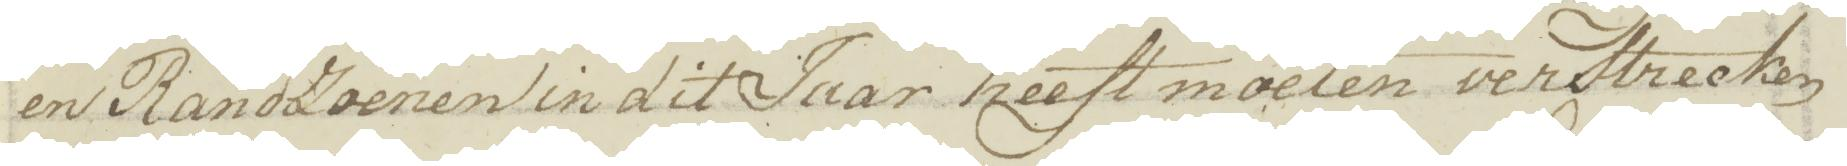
en Randzoenen in dit Iaar heeft moeten verstrecken
